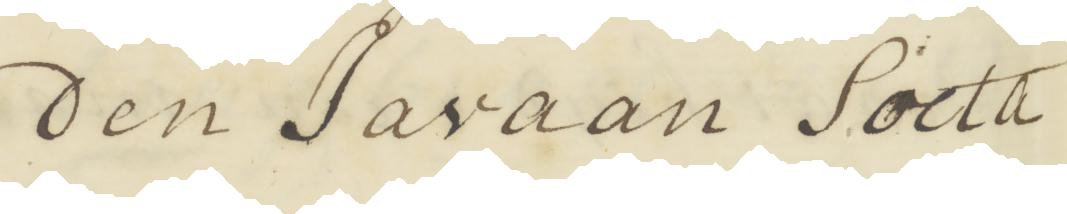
den Iavaan Soeta
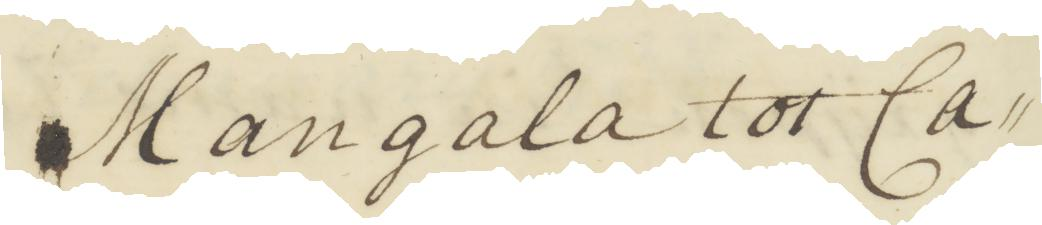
Mangala tot Ca„
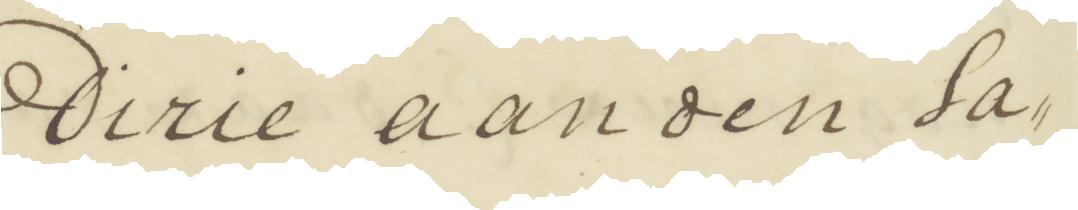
dirie aan den sa„
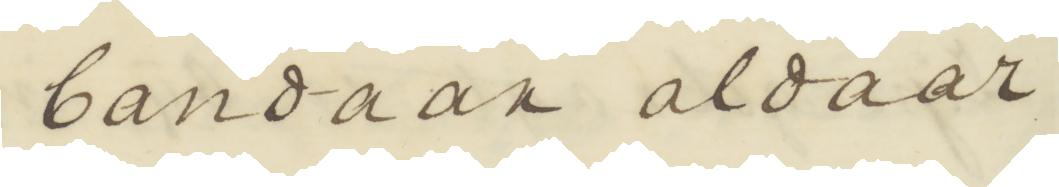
bandaar aldaar
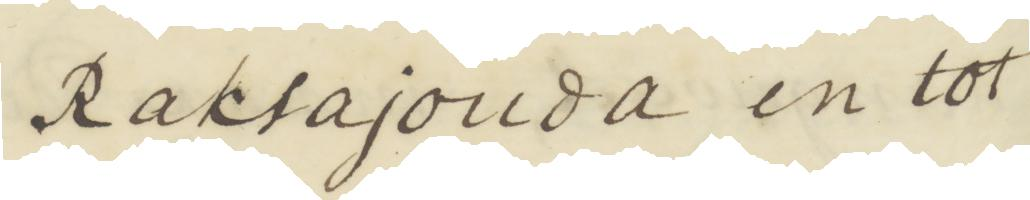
Raksajouda en tot
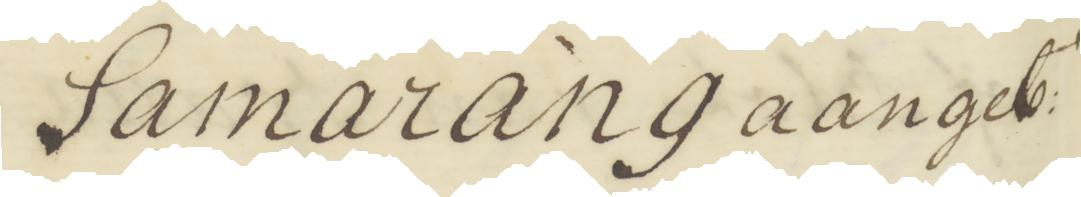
Samarang aan geb:
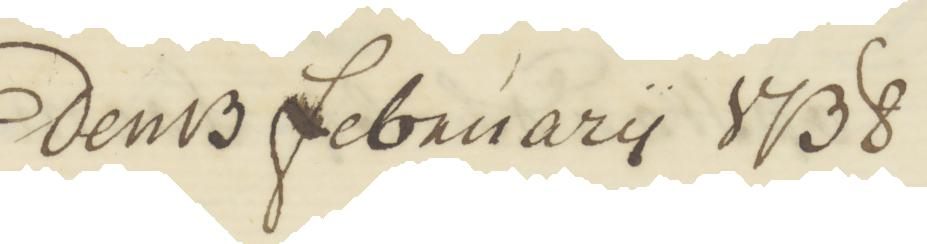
den13 februarij 1738
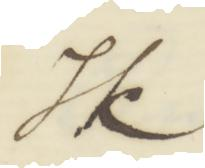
Ik
